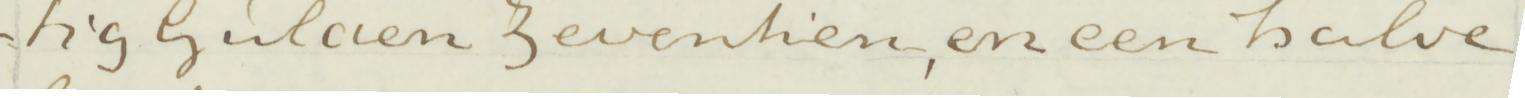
tig Gulden Zeventien, en een halve
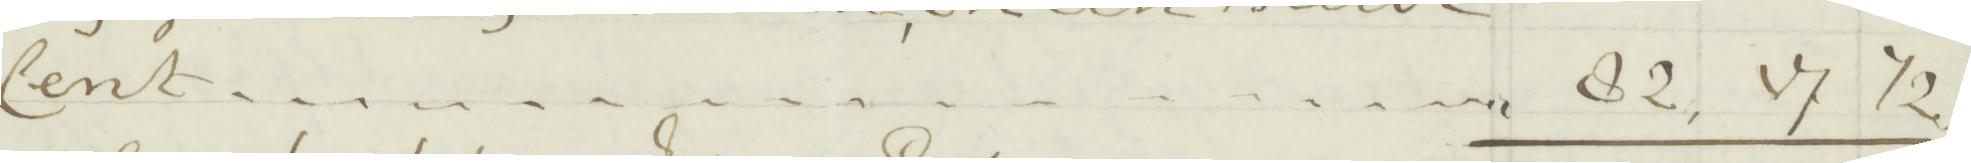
Cent - - - - - - - - - - - - - - - - - - „ 82„ 17 ½
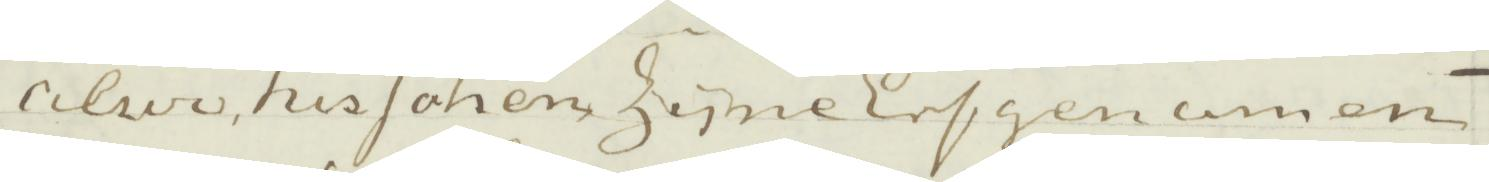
alzoo, tusschen zijne Erfgenamen
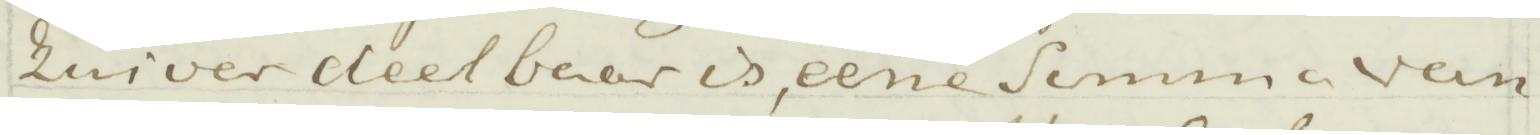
zuiver deelbaar is, eene somma van
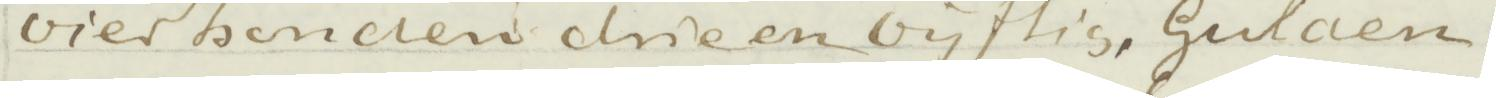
vier honderd drie en vijftig, Gulden
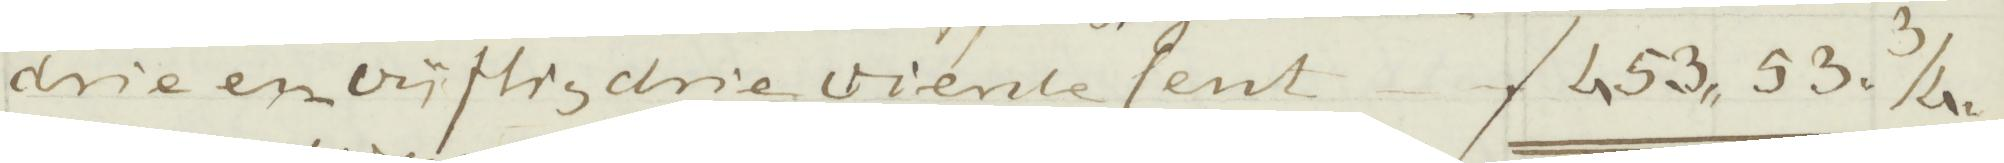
drie en vijftig drie vierde Cent ƒ453„ 53„ ¾„
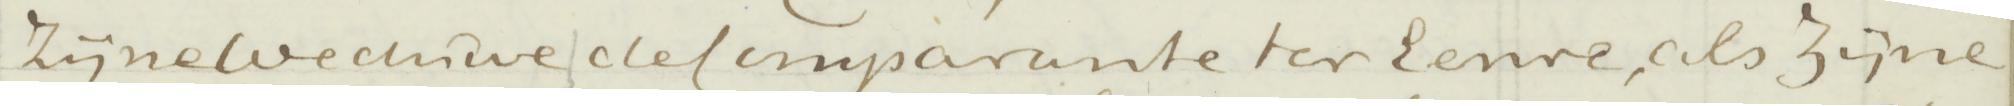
Zijne weduwe de Comparante ter Eenre, als zijne
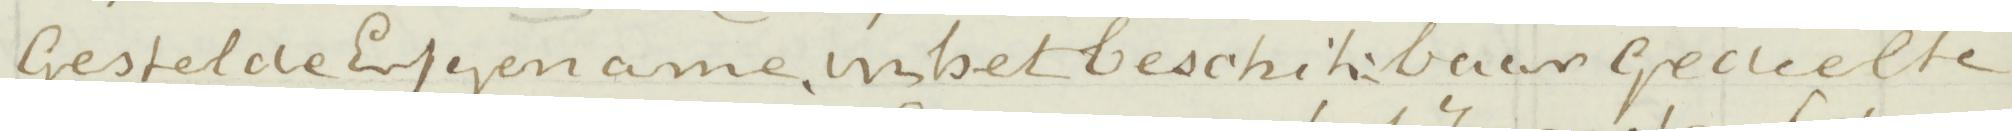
Gestelde Erfgename, in het beschikbaar Gedeelte
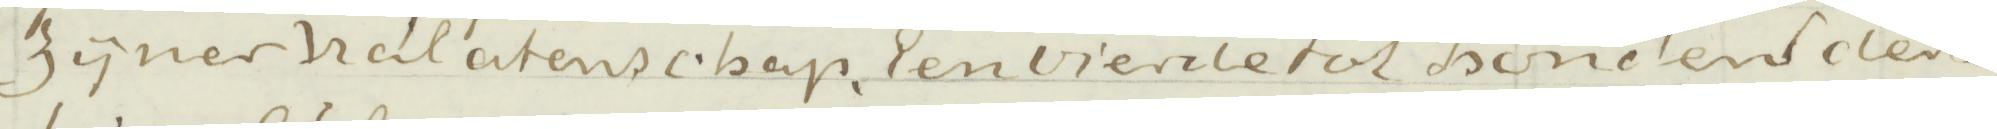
Zijner Nalatenschap, Een vierde tot honderd der-
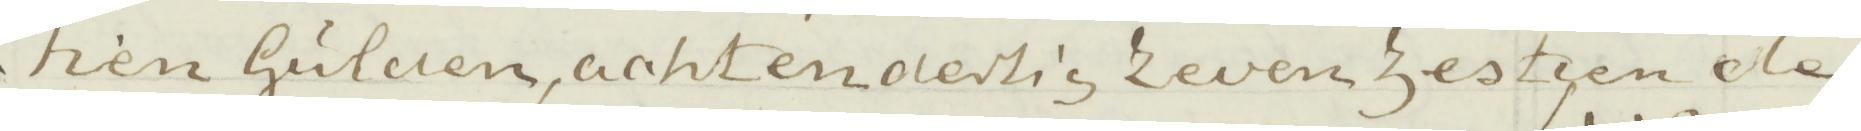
tien Gulden, acht en dertig zeven zestien de
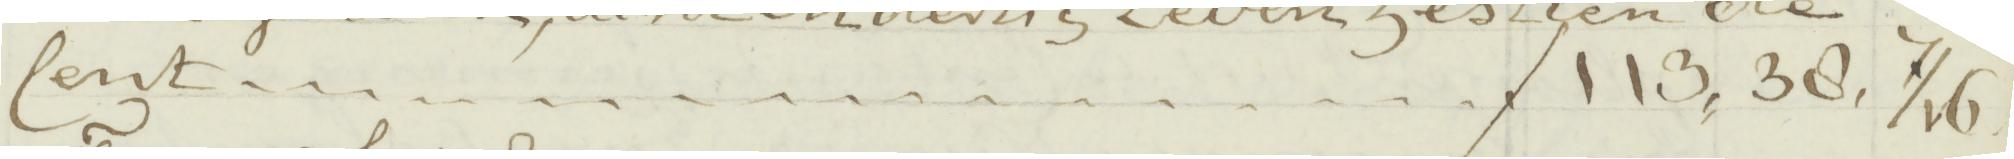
Cent - - - - - - - - - - - - - - - - - - ƒ113„ 38, 7/16
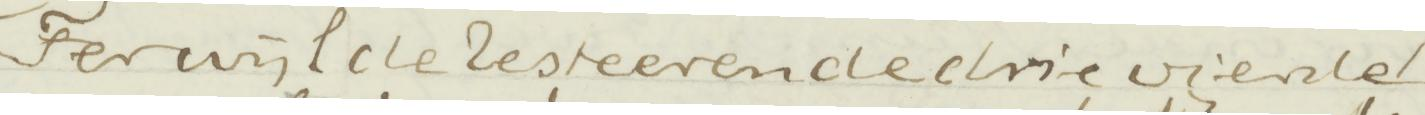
Terwijl de resteerende drie vierde
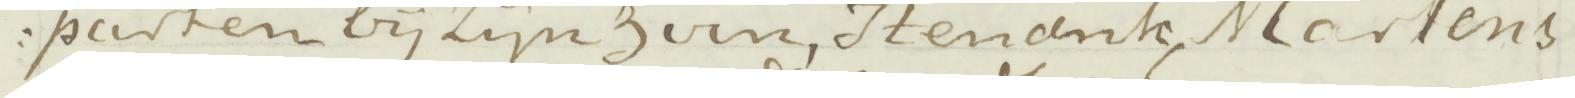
=parten bij zijn zoon, Hendrik Martens
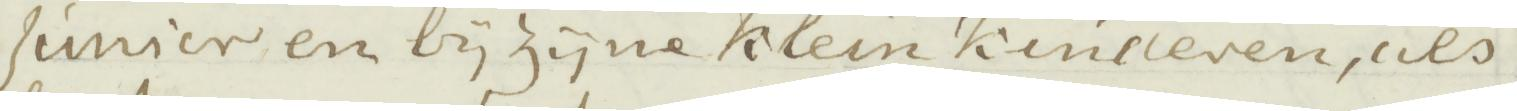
Junior, en bij zijne klein kinderen, als
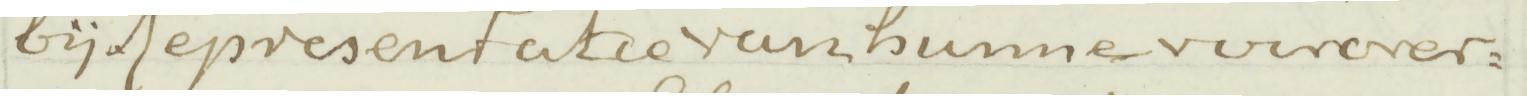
bij Representatie van hunne voorover=
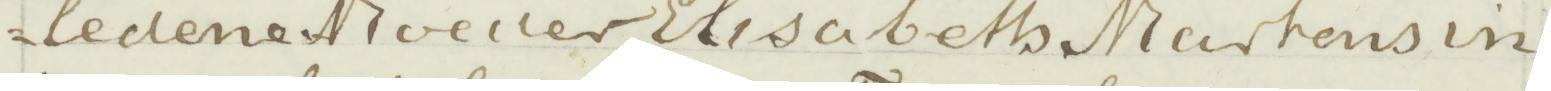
=ledene Moeder Elisabeth Martens in
